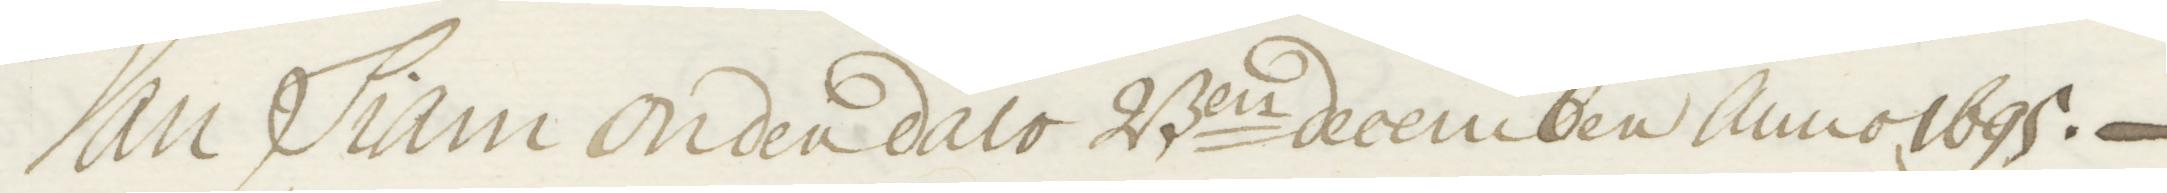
Van Siam onder dato 23=en December Anno 1695.
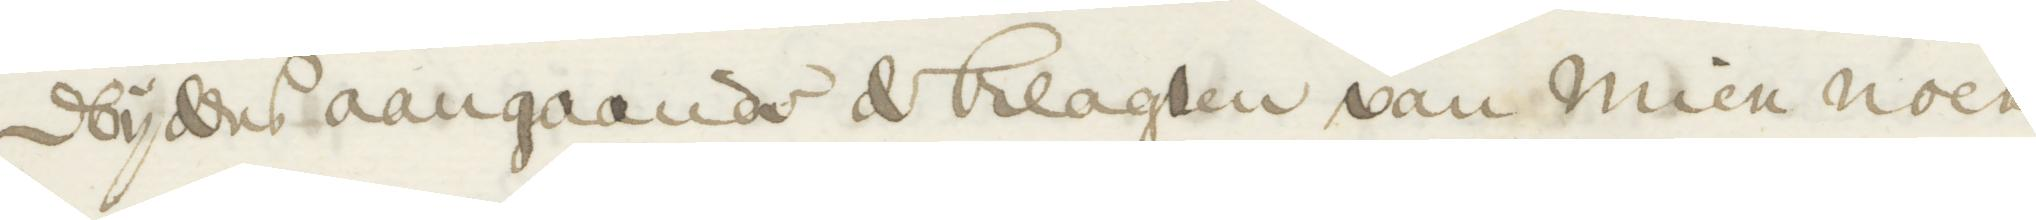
wijders aangaande de klagten van mier noer
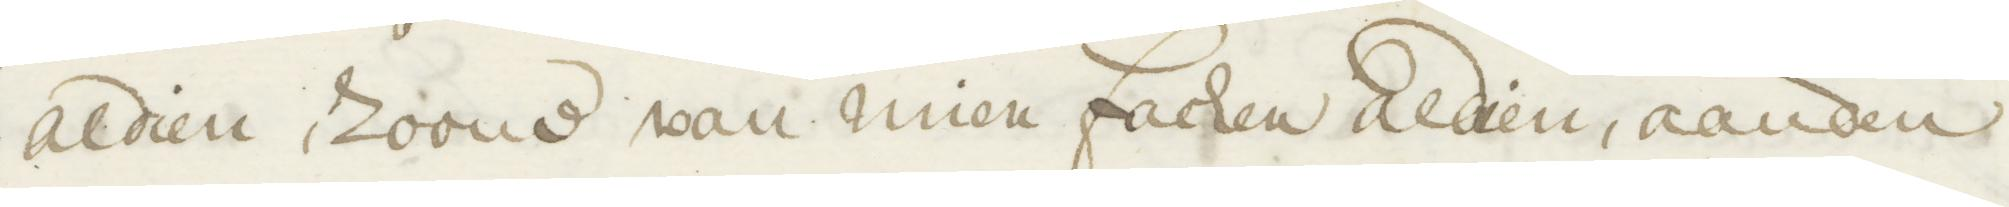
aldien, zoone van mier facher aldien, aanden
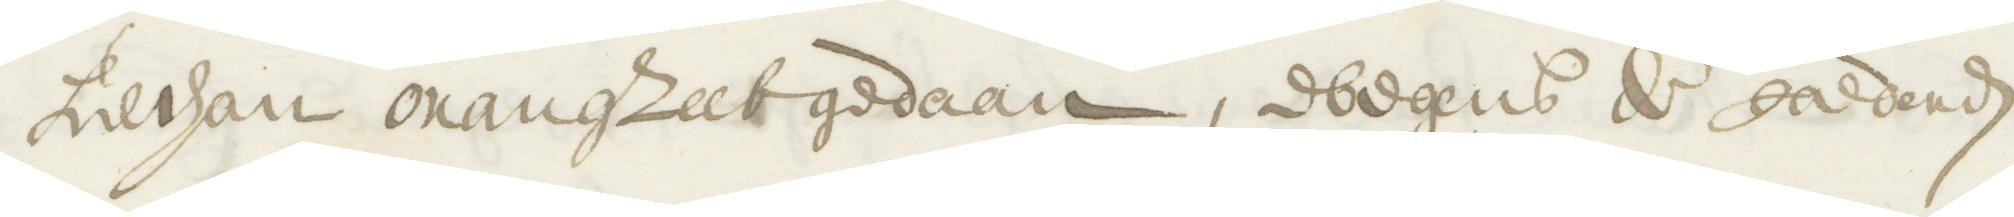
sulthan orangzeeb gedaan, wegens de goederen
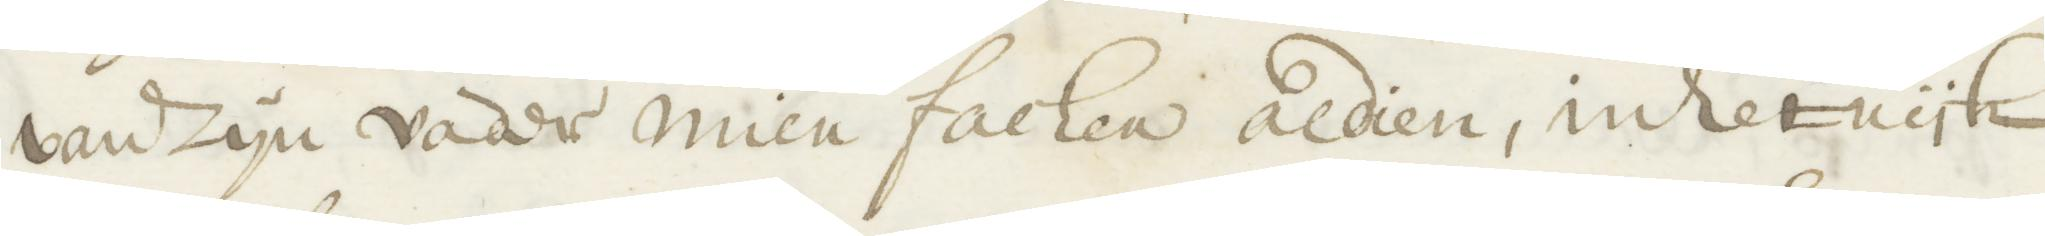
van zijn vader mier facher aldien, in het rijk
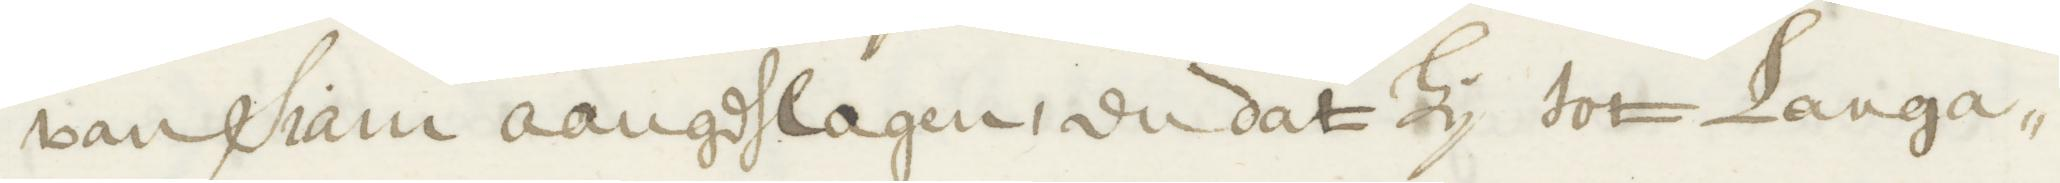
van Siam aangeslagen, en dat hij tot Larga„
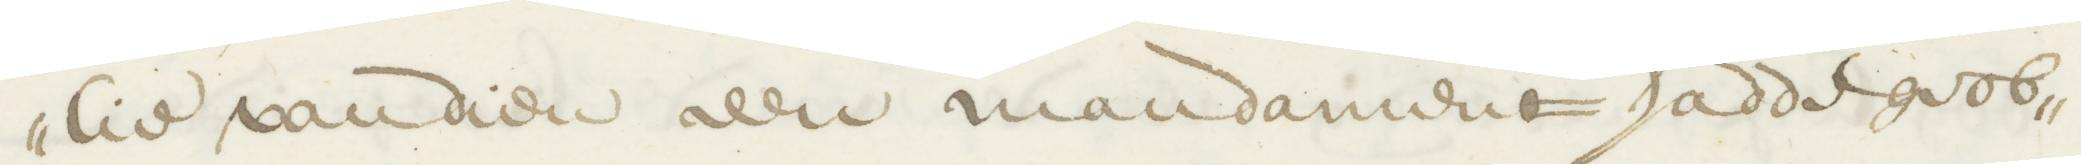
„tie van dien een mandament hadde geob„
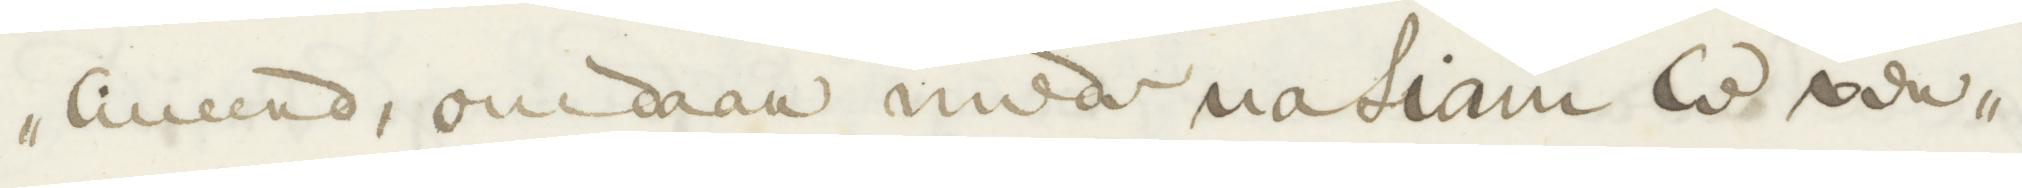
„tineerd, om daar mede na siam te ver„
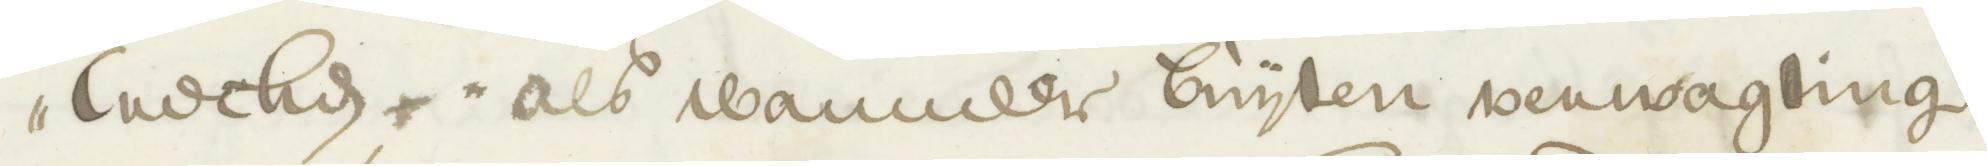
„trecken als wanneer buijten verwagtinge
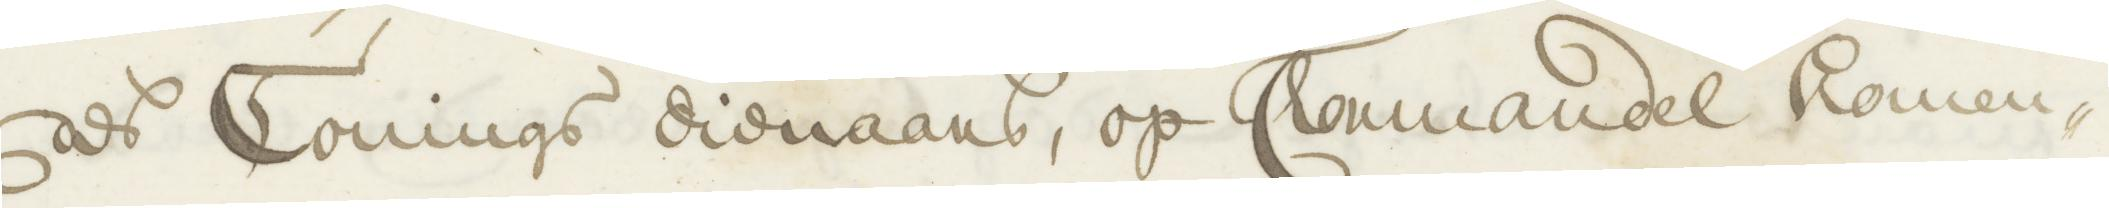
des Conings dienaars, op Chormandel komen„
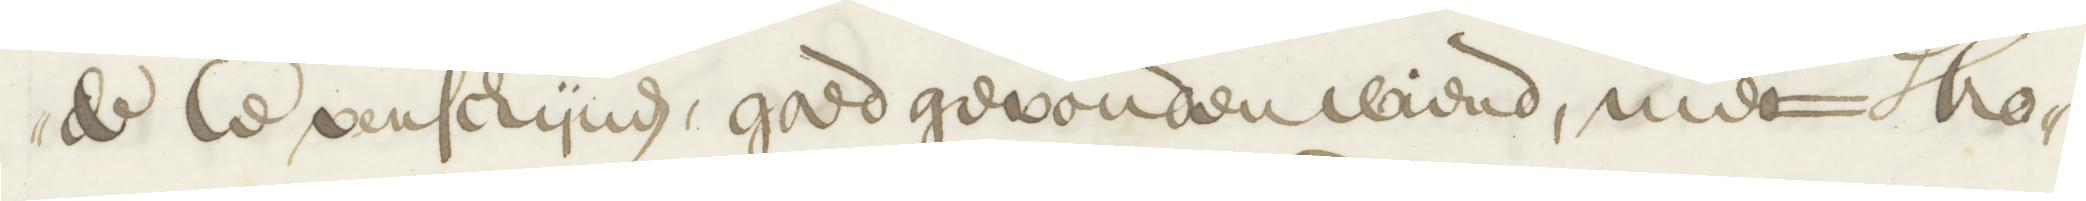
„de te verschijnen, goed gevonden wierd, met sko„
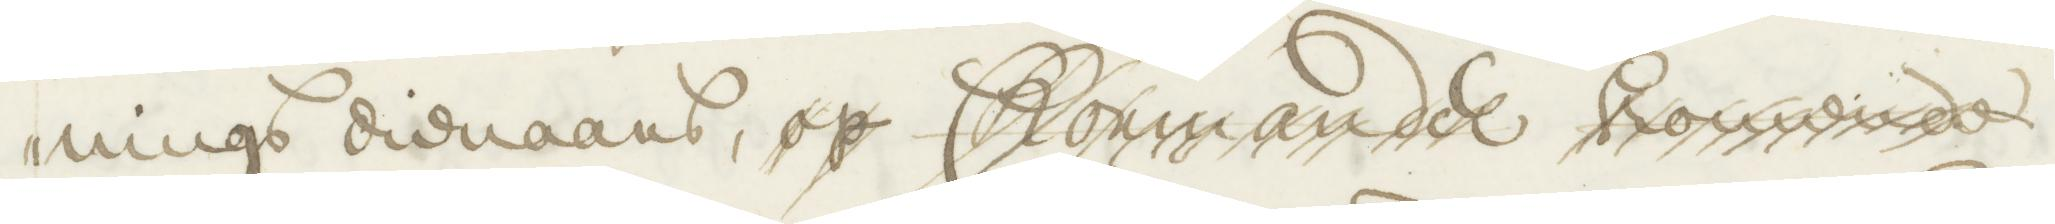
„nings dienaars, op Chormandel komende
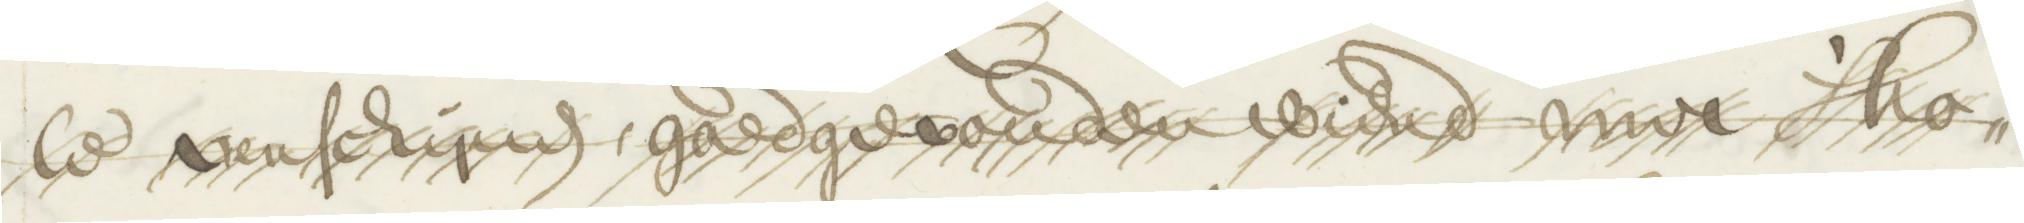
te verschijnen, goedgevonden wierd met 'sko„
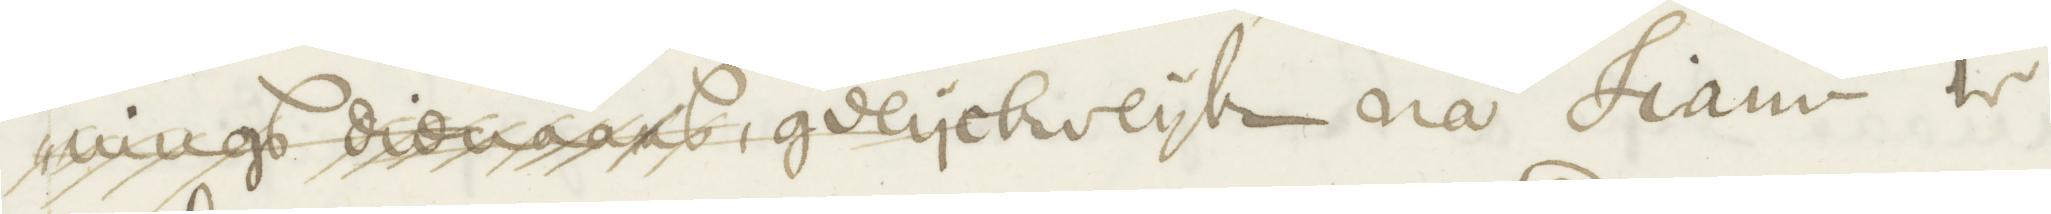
„nings dienaars, gelijckelijk na Siam te
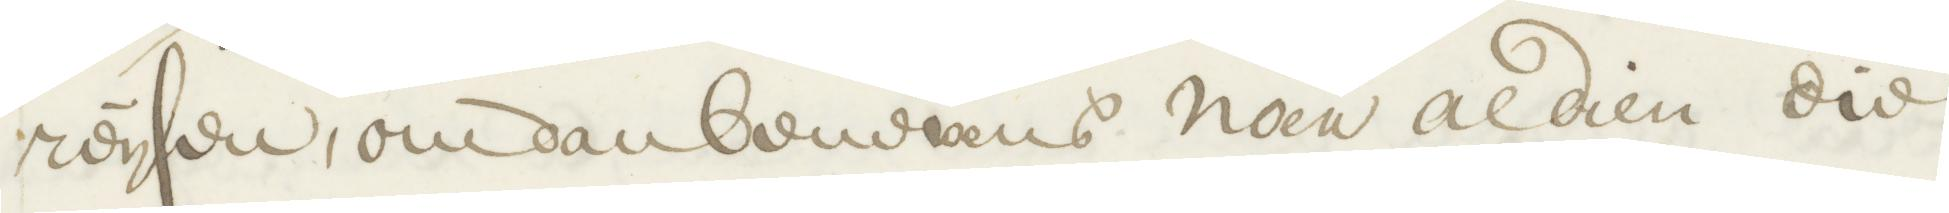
reijsen, om dan benevens noer aldien die
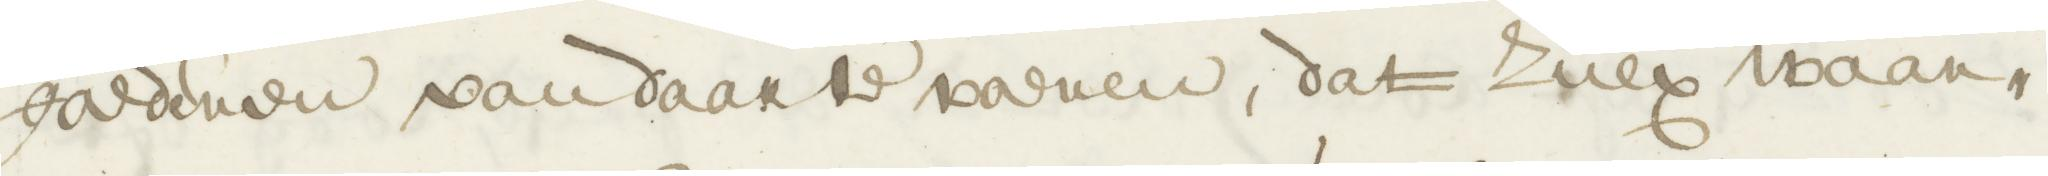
goederen van daar te voeren, dat zulx waar„
